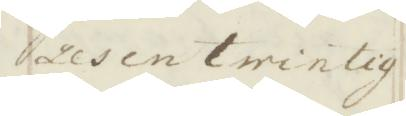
zes en twintig
